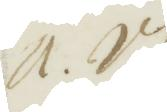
4. v=t
